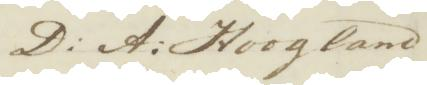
D: A: Hoogland
